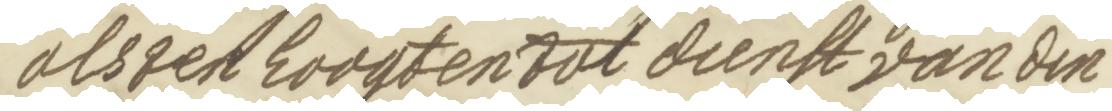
als ten hoogten tot dienst van din
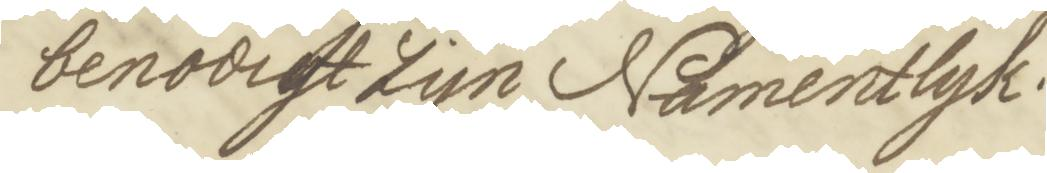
benodigt zijn Namentlyk.
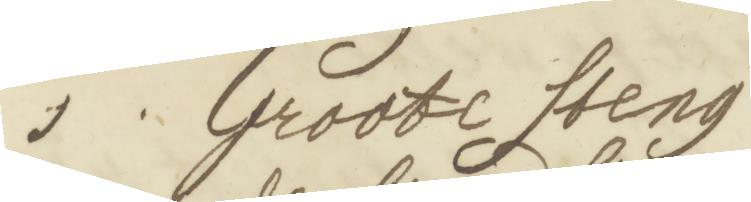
1. Groote steng
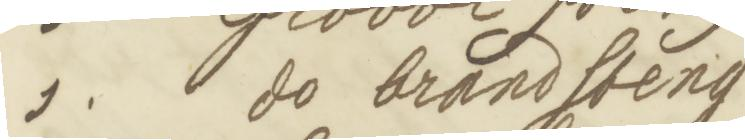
1. do brand steng
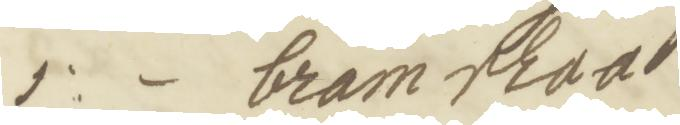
1: – bram rhaa
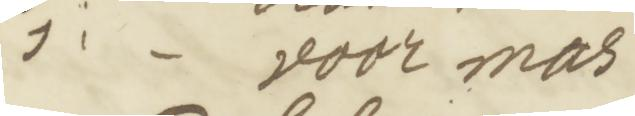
1. – voor mas
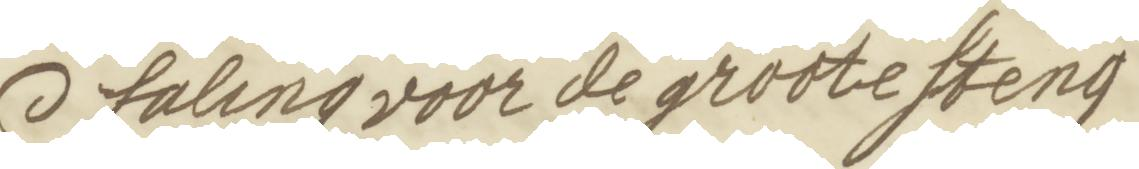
Saling voor de groote steng
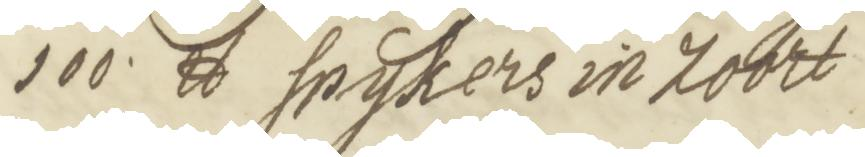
100. lb spykers in zoort
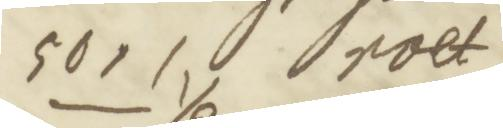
501 1 voet
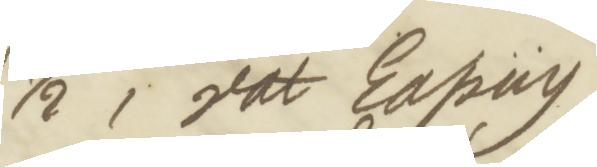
— ½ 1 vat hapuy
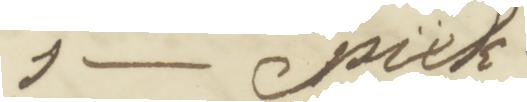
1 — piek
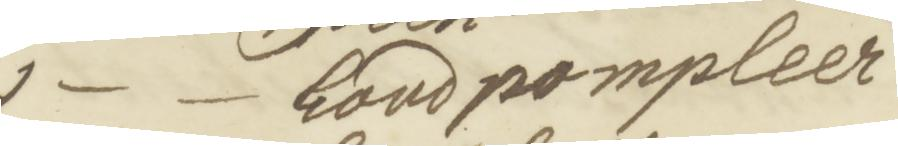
1 — — hard pompleer
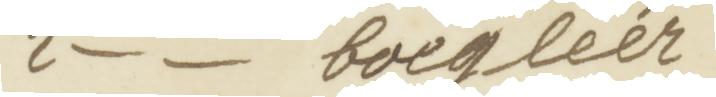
2 — — boegleer
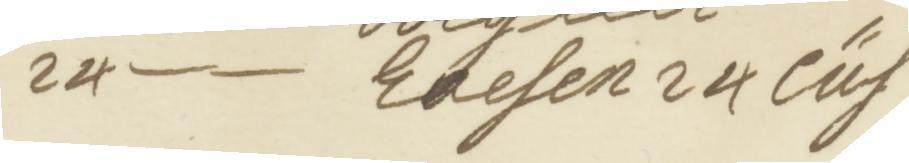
24 — — hoesen 24 cus
